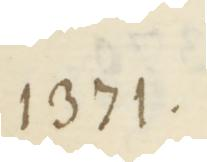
1371.
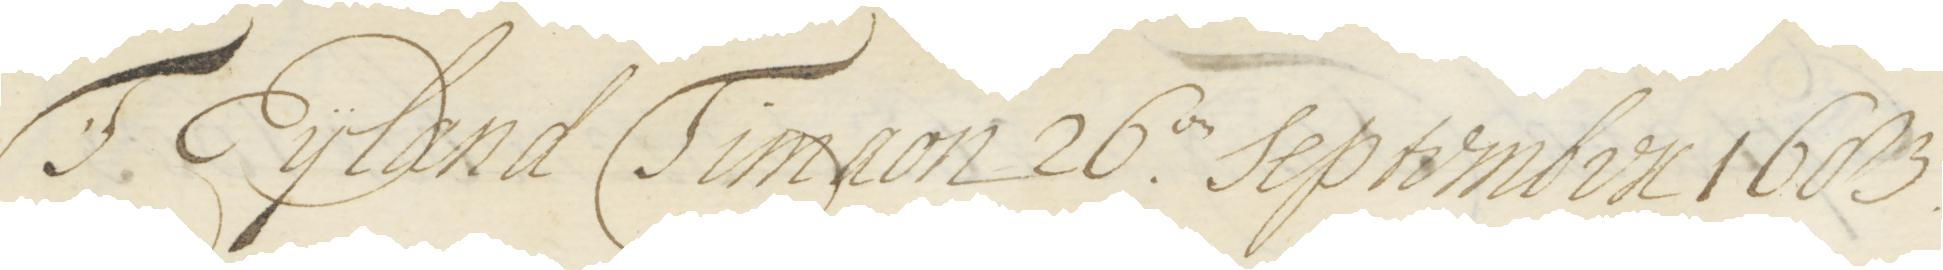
T Eijland Timaon 26:en september 1683.
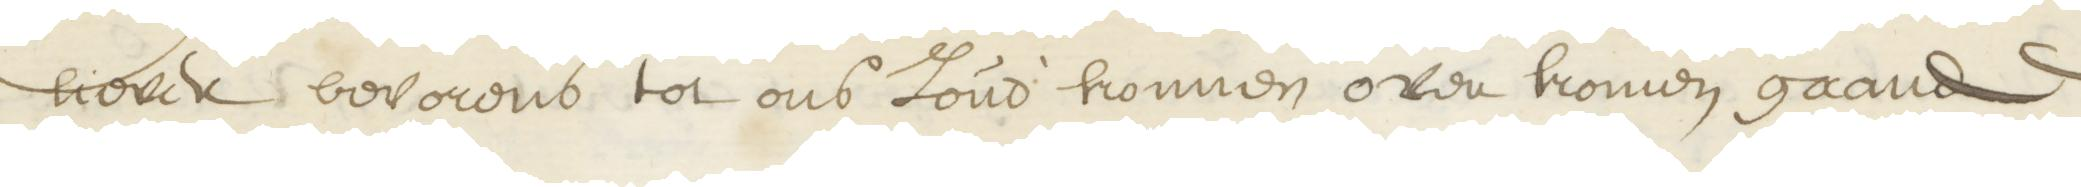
liever bevorens tot ons Zoud' konnen over komen gaande
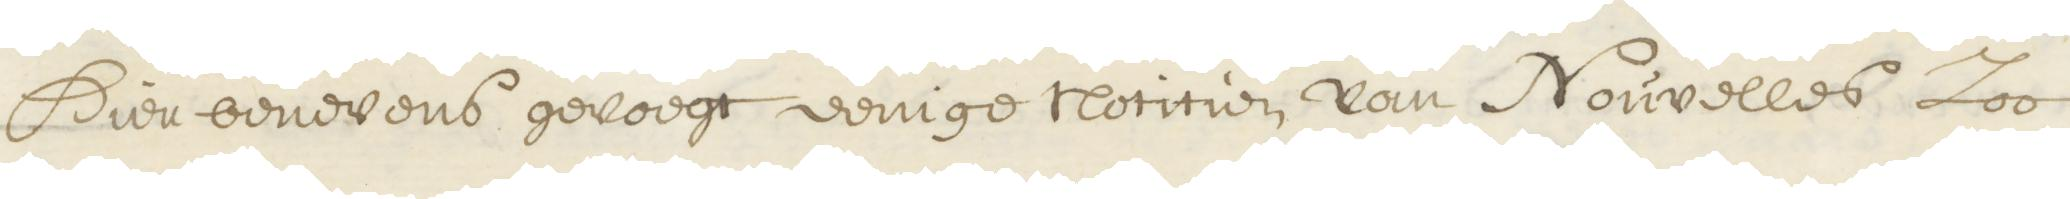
Hier benevens gevoegt eenige notitiën van Nouvelles Zoo
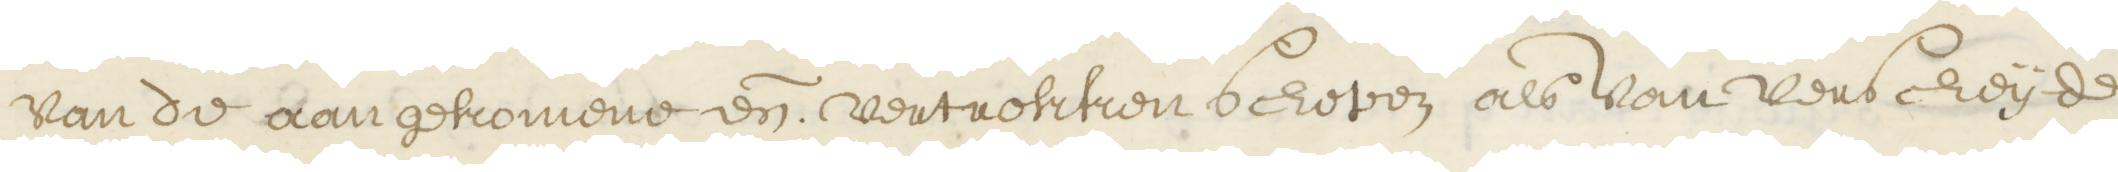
van de aangekomene ende vertrokken schepen als van verscheijde
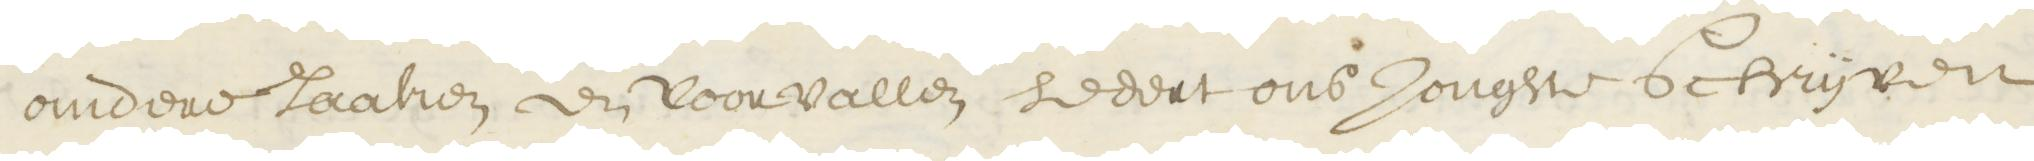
andere zaaken en voorvallen sedert ons Jongste schrijven
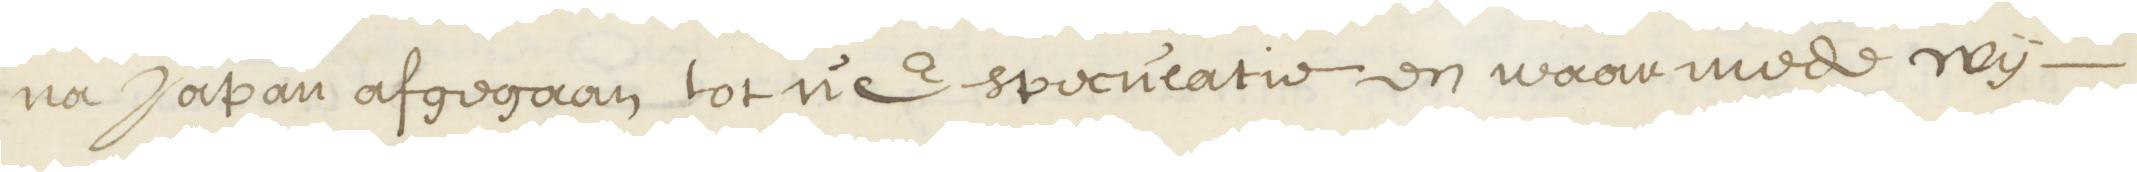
na Japan afgegaan tot u E speculatie en waar mede wij -
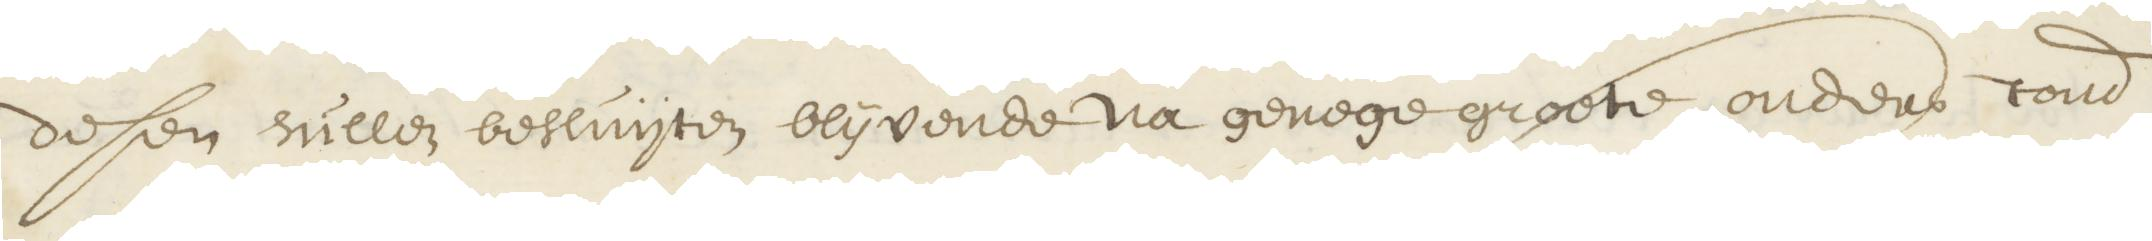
desen sullen besluijten blijvende na genege groete onder stond
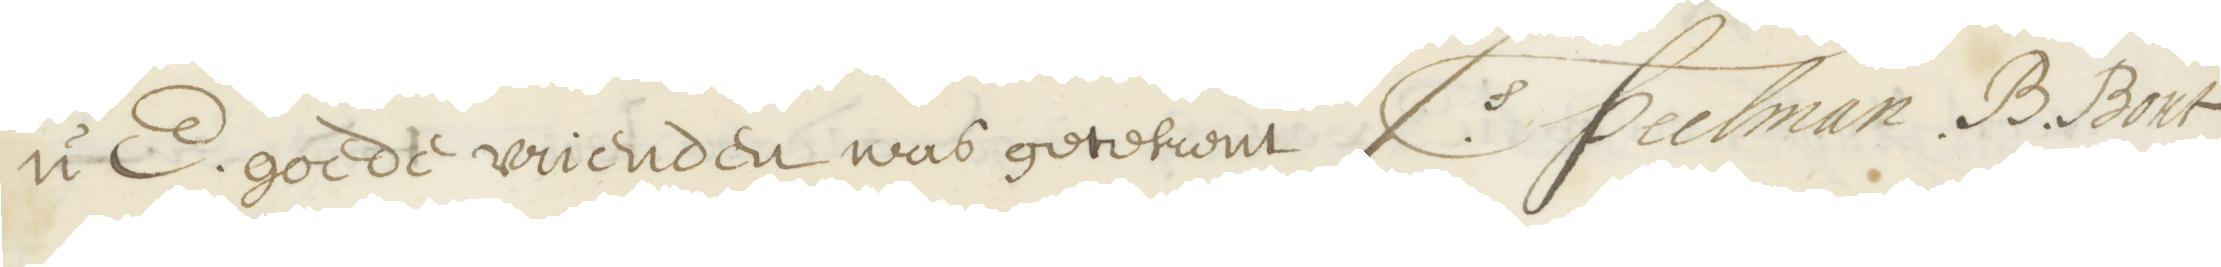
u E. goede vrienden was getekent C.s Peelman B. Bort
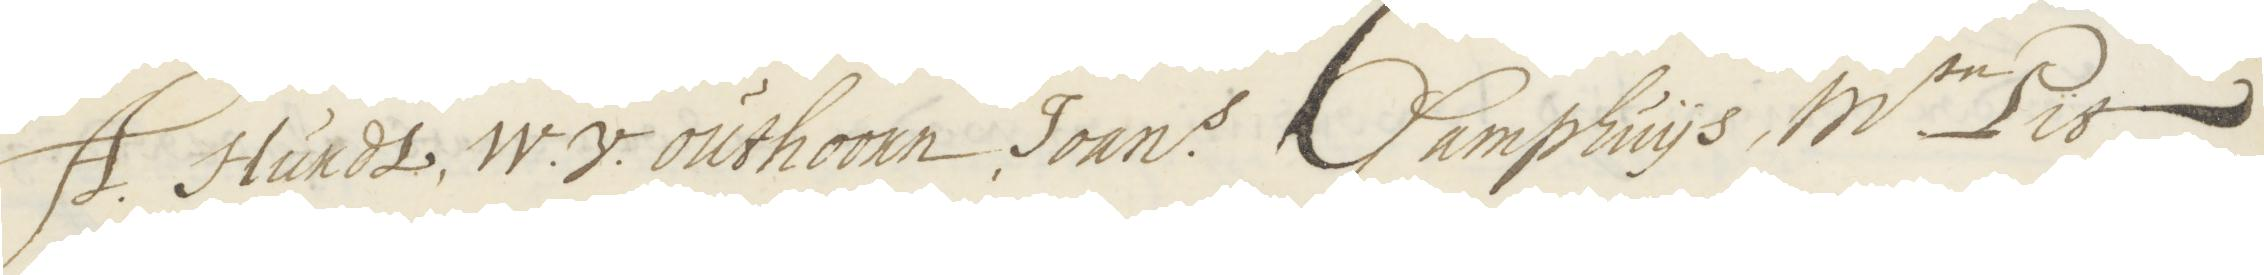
A. Hurdt, W. V. outhoorn, Joan.s Camphuijs, M:tn Pit
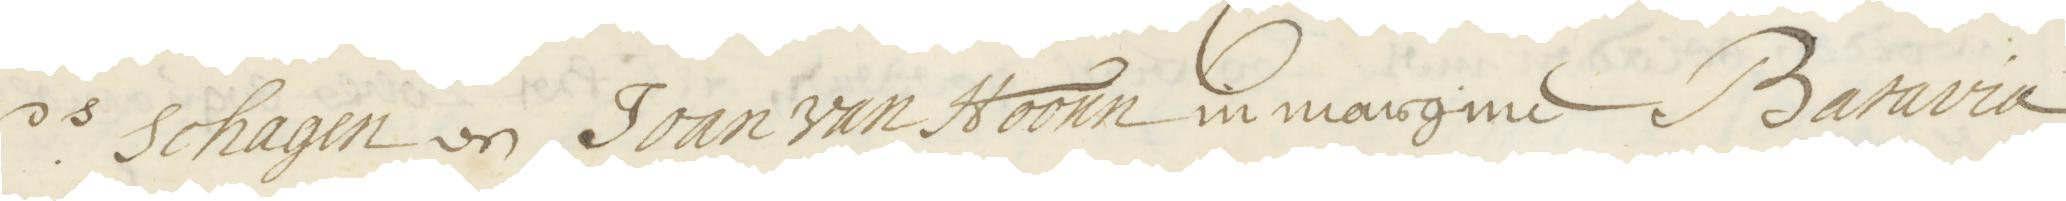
N.s schagen en Joan van Hoorn in margine Batavia
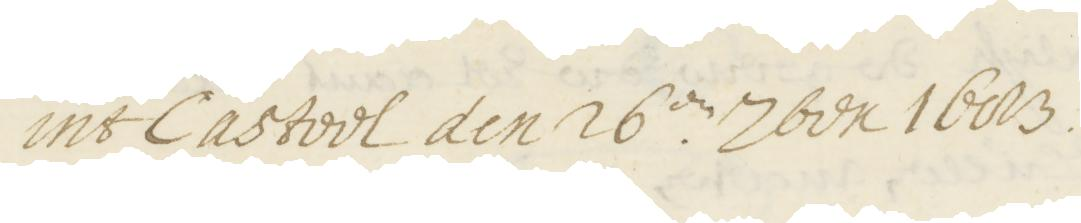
in ’t Casteel den 26.en 7ber 1683.
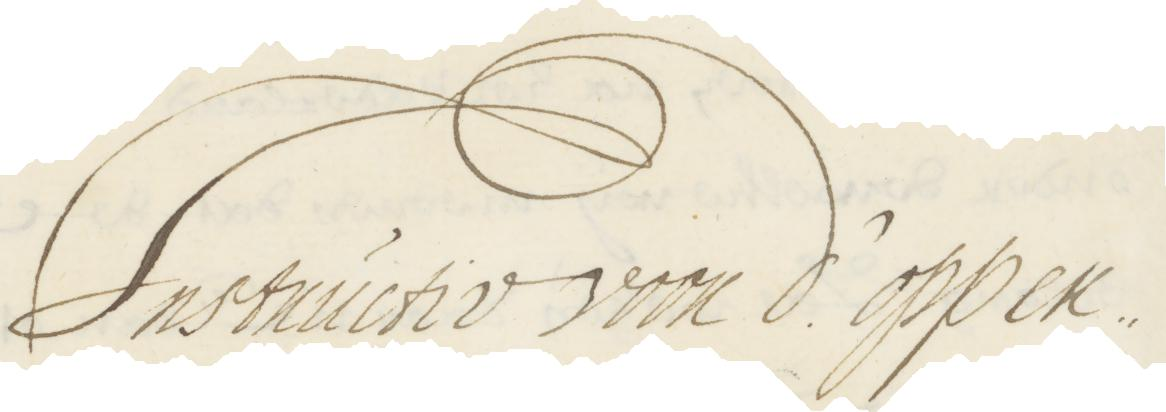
Instructiv voor d' opper„
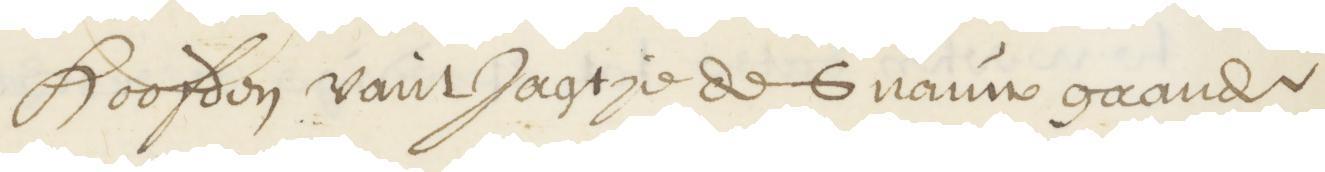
Hoofden van 't Jagtje de Snauw gaande
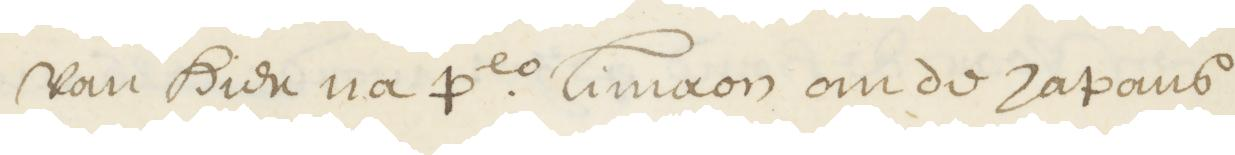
van Hier na p.lo Timaon om de Iapans
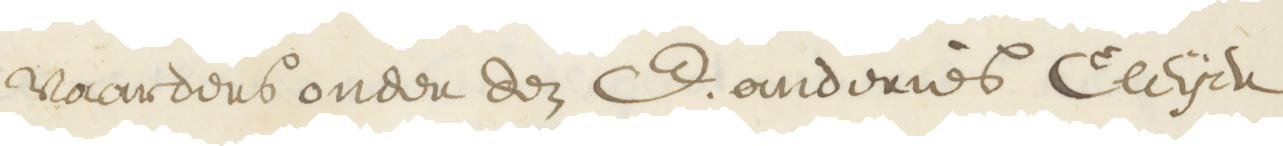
vaarders onder den E. anderies Cleijer
